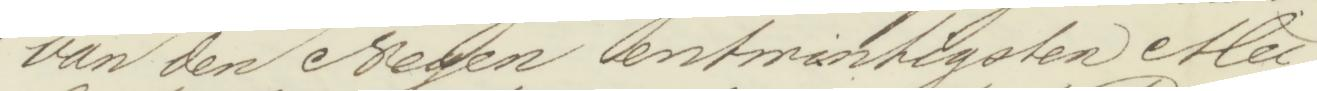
van den Negen entwintigsten Mei
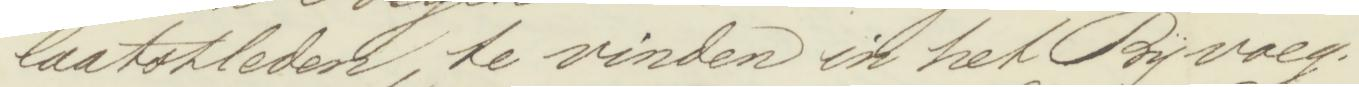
laatstleden, te vinden in het Bijvoeg,
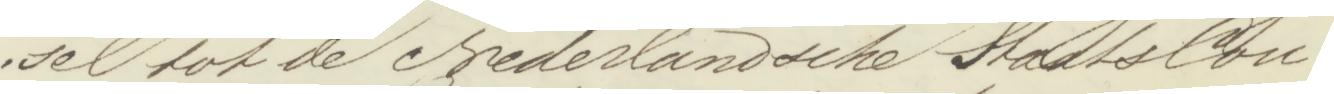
sel tot de Nederlandsche StaatsCou
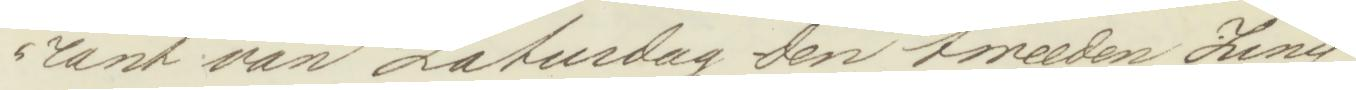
„rant van Zaturdag den tweeden Iunij
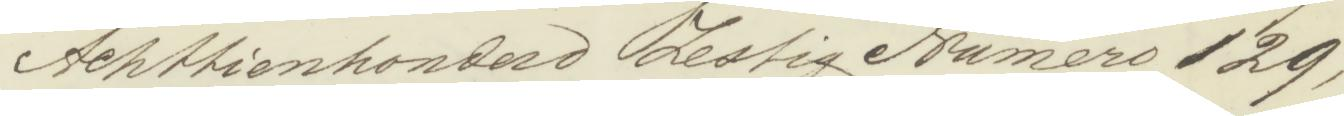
Achttienhonderd Zestig Numero 129,
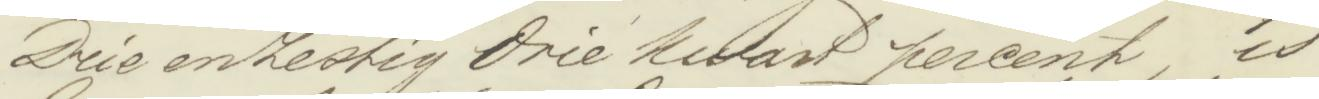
Drie en Zestig drie kwart percent, is
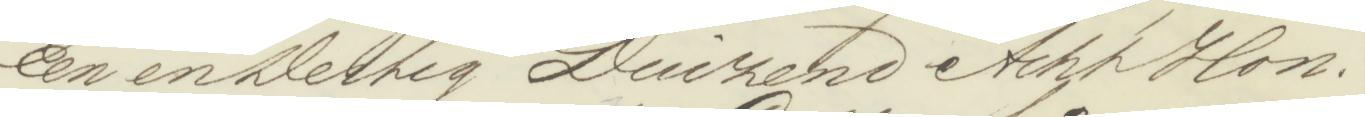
Een enDertig Duizend Acht Hon.
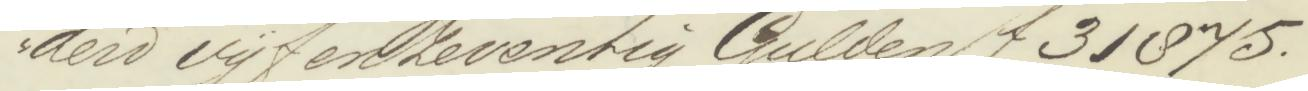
„derd vijf enzeventig Gulden ƒ 31875.
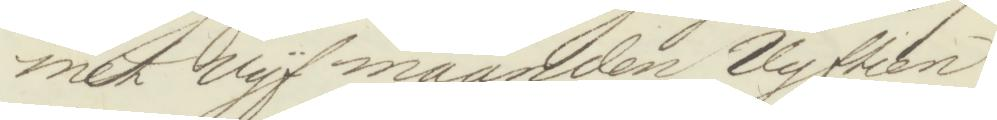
met vijf maanden Vijftien
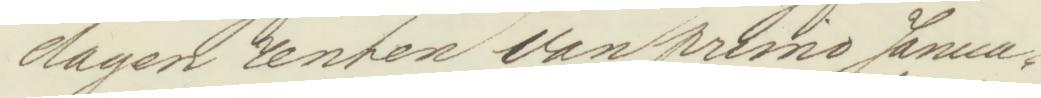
dagen renten van primo Janua„
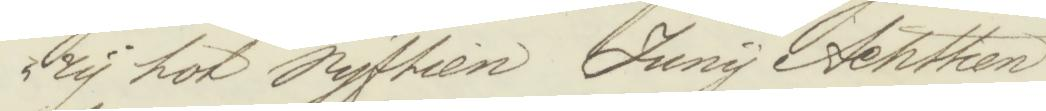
rij tot Vijftien Junij Achttien
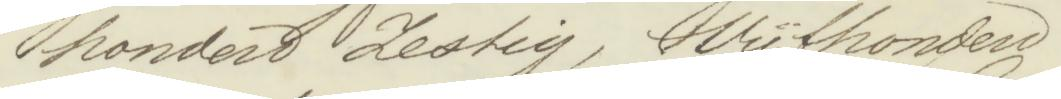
honderd Zestig,Vijfhonderd
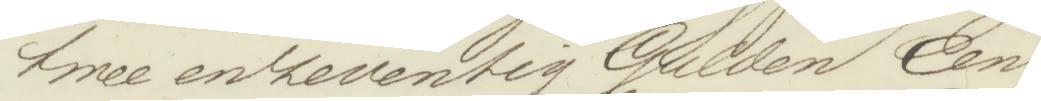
twee en zeventig Gulden Een
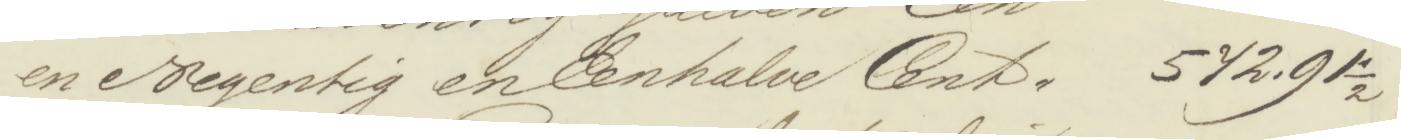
en Negentig enEenhalve Cent„ 572.91½
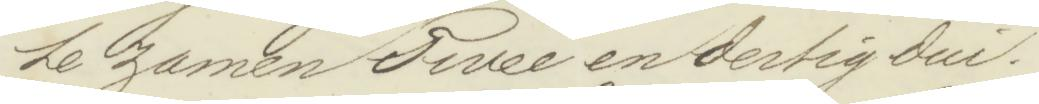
te zamen Twee en dertig dui.
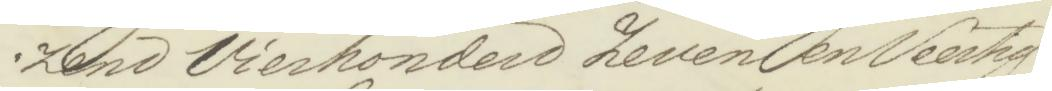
„zend Vierhonderd Zeven enVeertig
